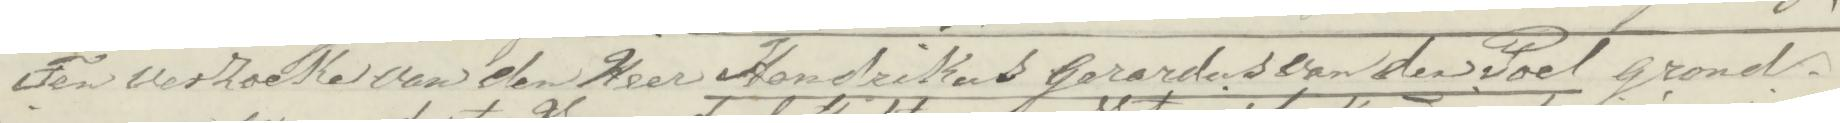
Ten verzoeke van den Heer Hendrikus Gerardus van der Poel grond-
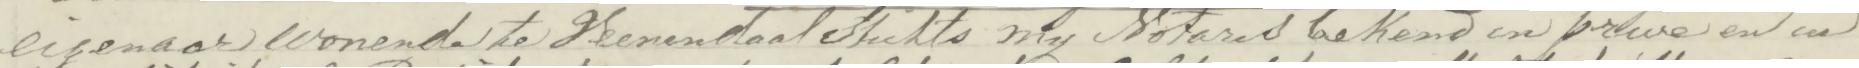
eigenaar, wonende te Veenendaal stichts mij Notaris bekend in privé en in
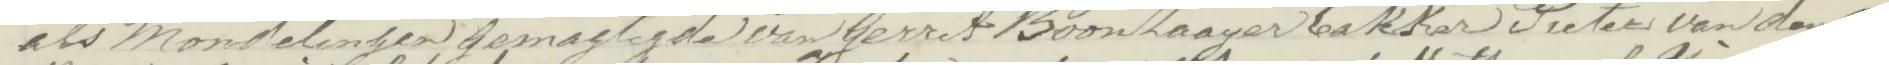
als mondelingen gemagtigde van Gerrit Boonzaayer bakker Pieter van den
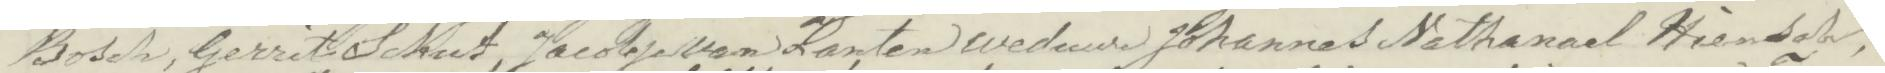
Bosch, Gerrit Schut, Jacobje van Zanten weduwe Johannes Nathanael Hiensch,
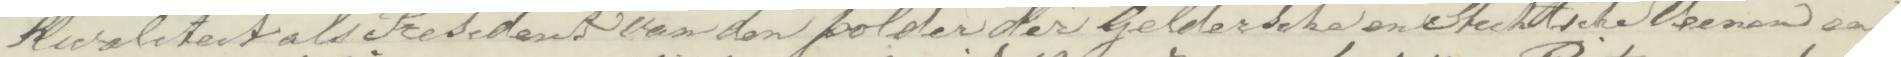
Kwaliteit als President van den polder der Geldersche en Stichtsche Veenen en
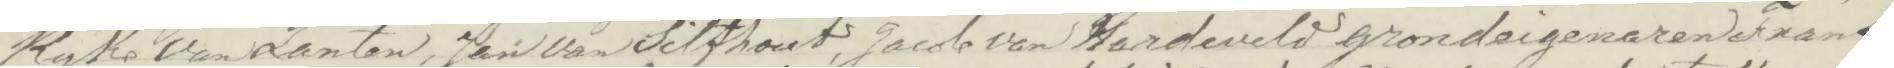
Ryk van Zanten, Jan van Silfhout, Jacob van Hardeveld grondeigenaren Frans
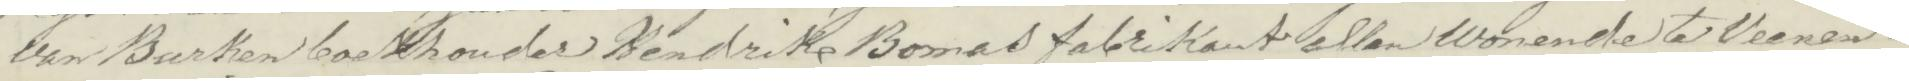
van Burken boekhouder Hendrik Bomas fabrikant allen wonende te Veenen=
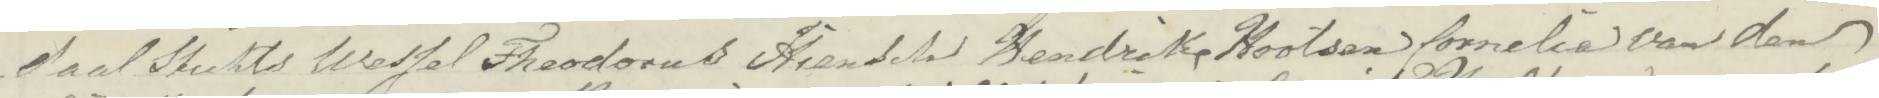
daal Stichts Wessel Theodorus Hiensch Hendrik Hootsen Cornelia van den
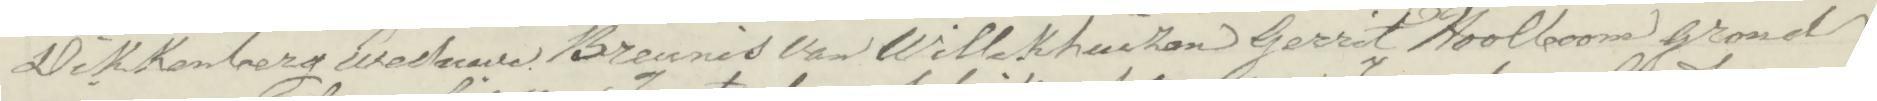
Dikkenberg weduwe Breunis van Willikhuizen Gerrit Hoolboom grond
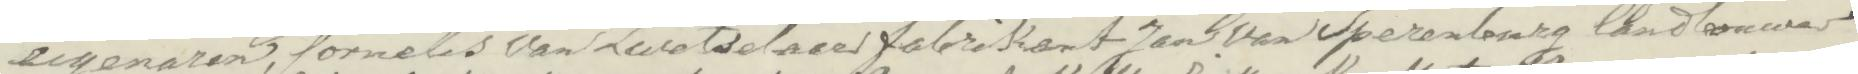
Eigenaren, Cornelis van Zwetselaar fabrikant Jan van Sperenburg landbouwer
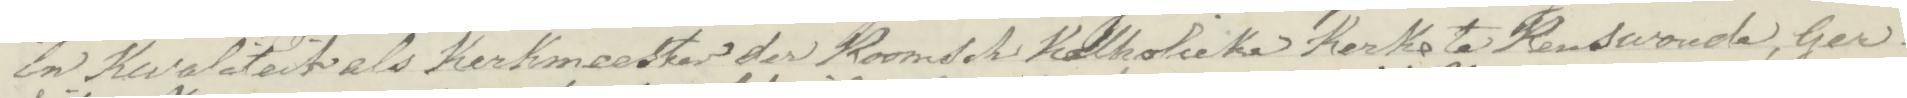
in kwaliteit als kerkmeester der Roomsch katholieke kerk te Renswoude, Ger
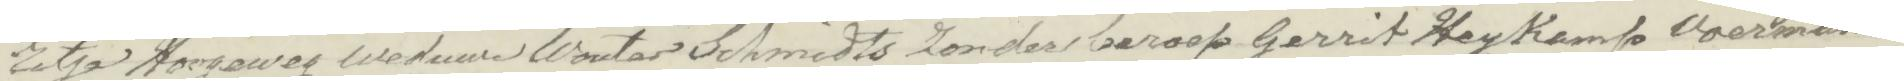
ritje Hoogeweg weduwe Wouter Schmidts zonder beroep Gerrit Heykamp Voerman
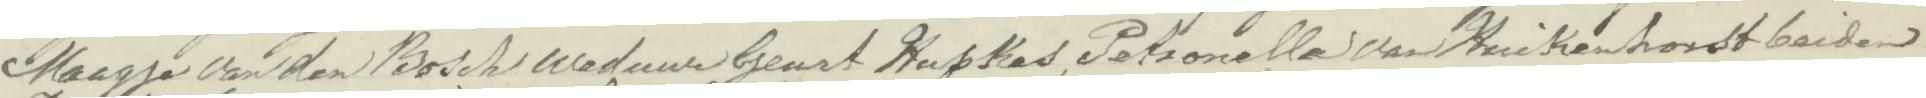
Maagje van den Bosch weduwe Geurt Hupkes, Petronella van Huikenhorst beiden
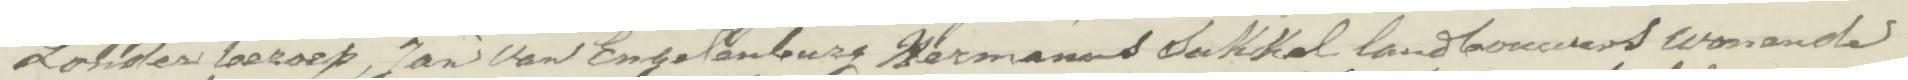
zonder beroep, Jan van Engelenburg Hermanus Sukkel landbouwers wonende
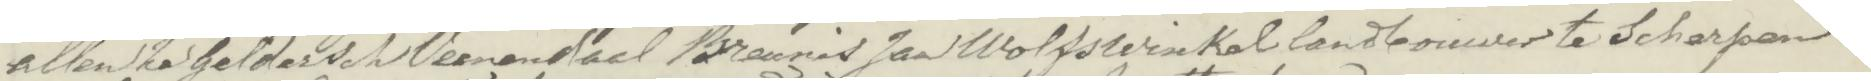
allen te Geldersch Veenendaal Breunis Jan Wolfswinkel landbouwer te Scherpen
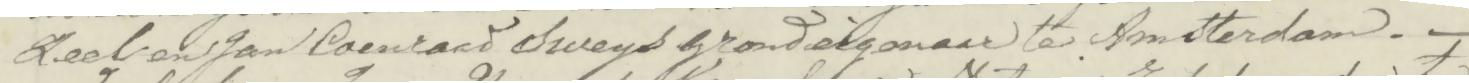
zeel en Jan Coenraad Sweijs grondeigenaar te Amsterdam. -
